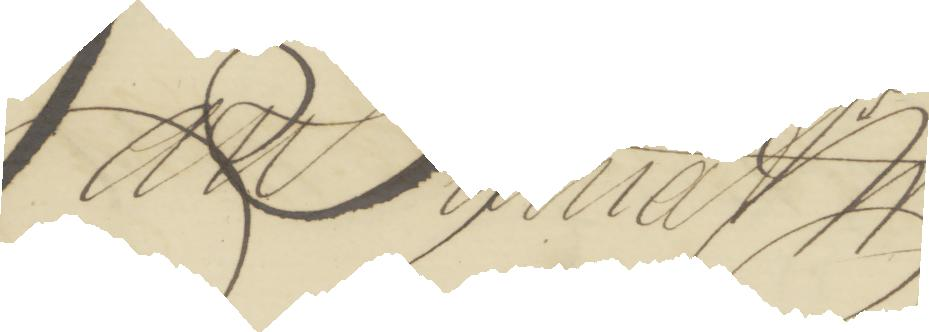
Van Sumat:s
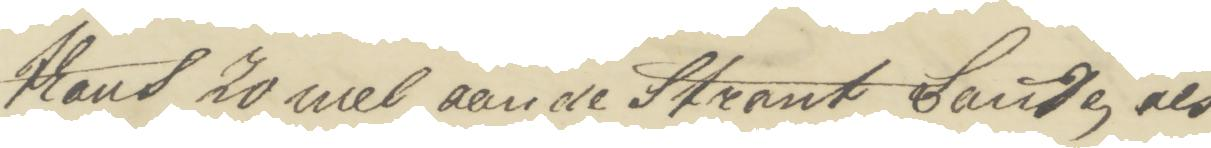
thans Zo wel aan de strant Landen, als
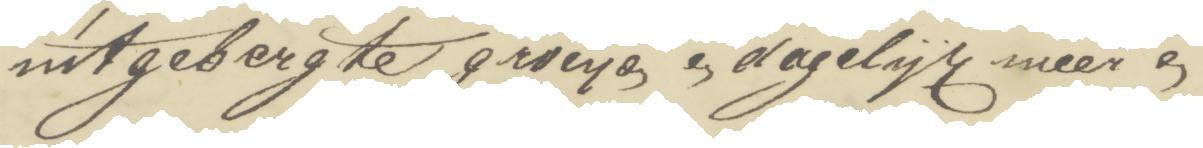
in't gebergte groeijen en dagelijx meer en
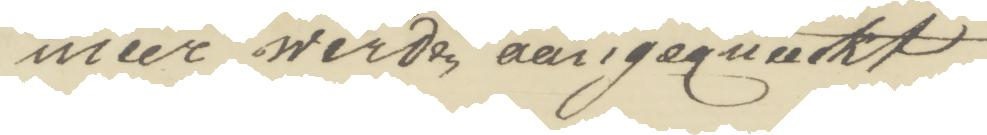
meer werden aangequeekt
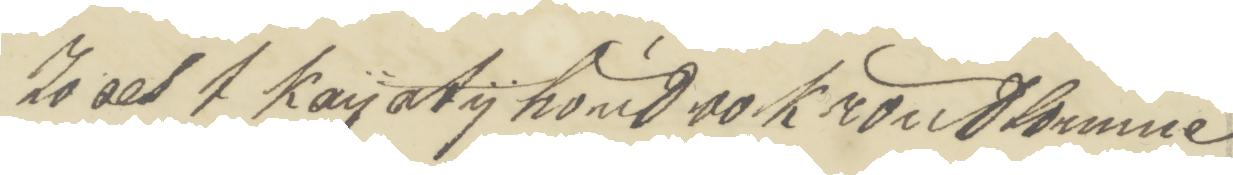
zo als t kaijatij houd ook rond omme
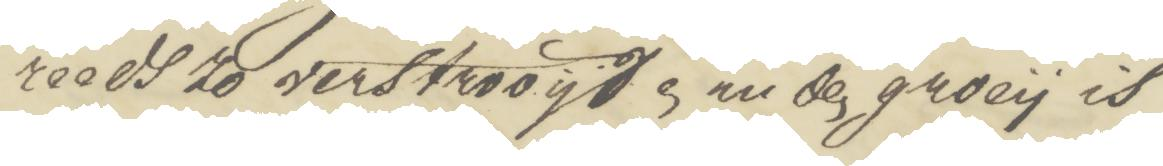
reeds zo verstrooijd en in de groeij is
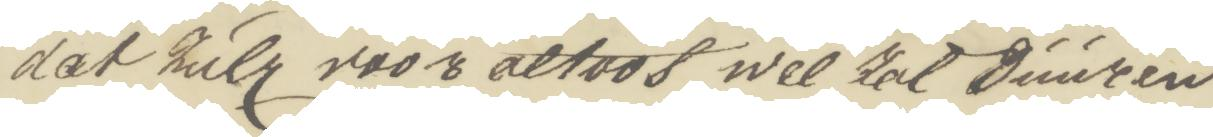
dat zulx voor altoos wel zal duuren
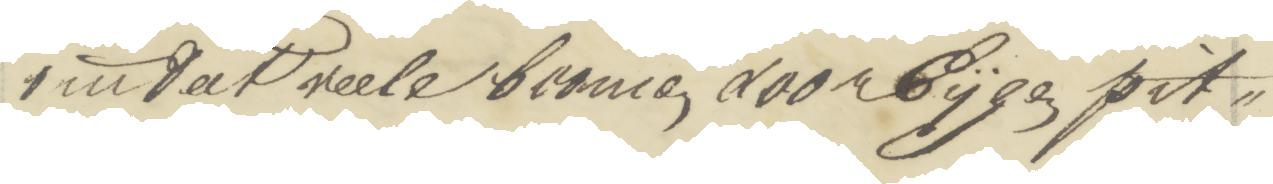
omdat veele boomen door Eijgen pit„
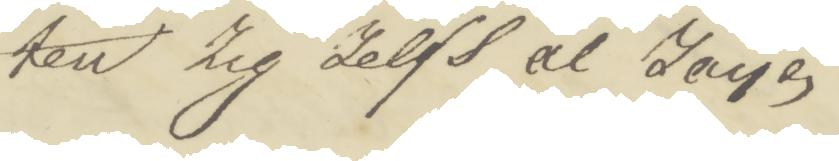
ten zig selfs al zaijen
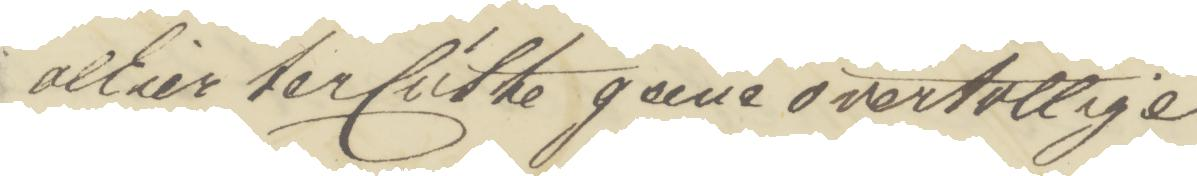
alhier ter Custe geene overtollige
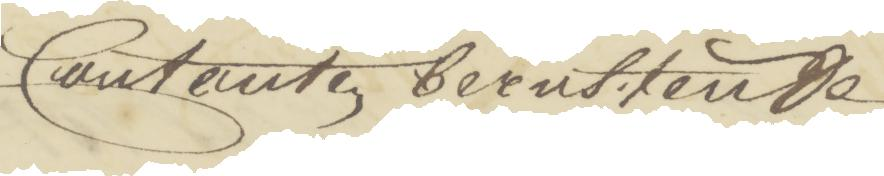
Contanten berustende
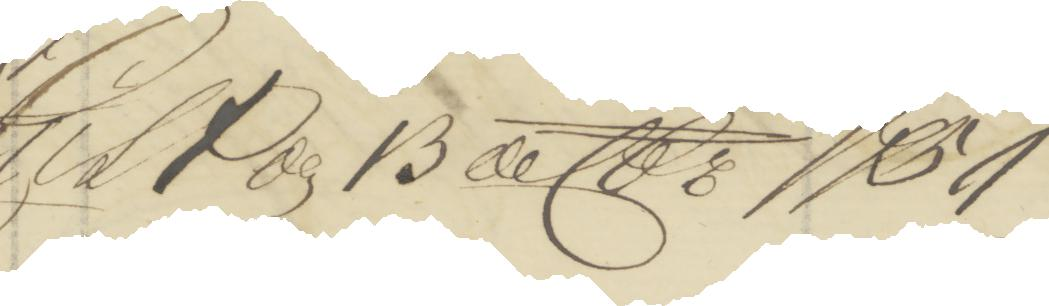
Cust den 13 deCbr 1754
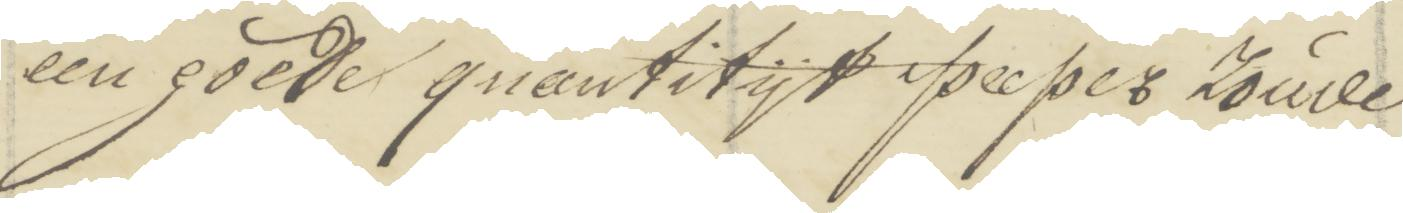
een goede quantitijt peeper zoude
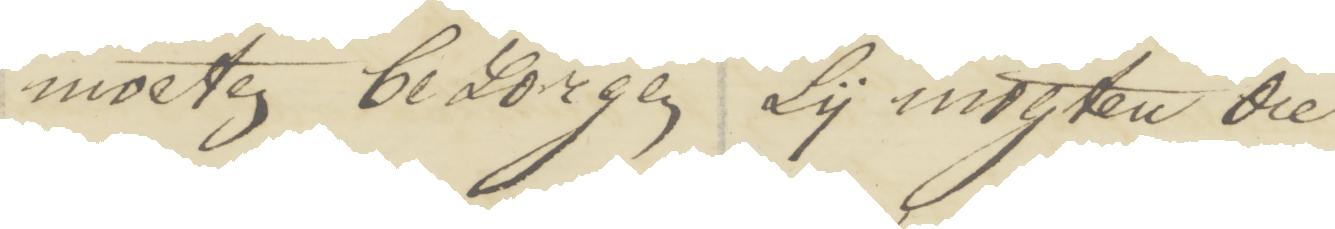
moeten bezorgen Sij mogten die
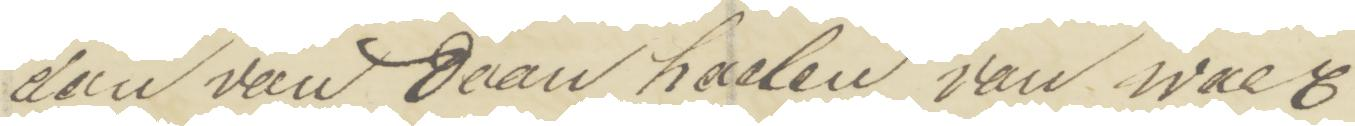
dan van daan haelen van waer
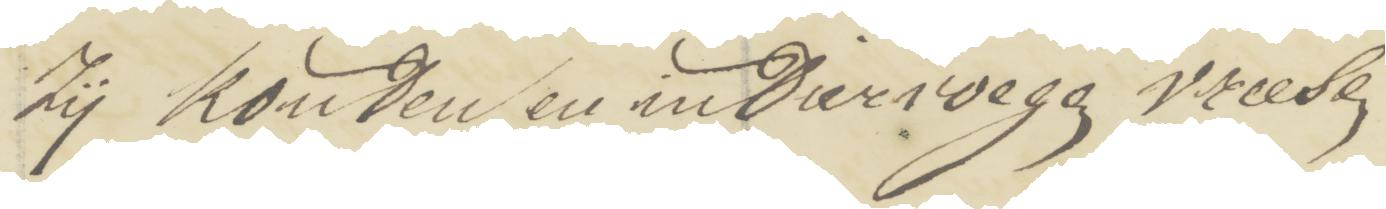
Zij konden en in dier voegen vreesen
